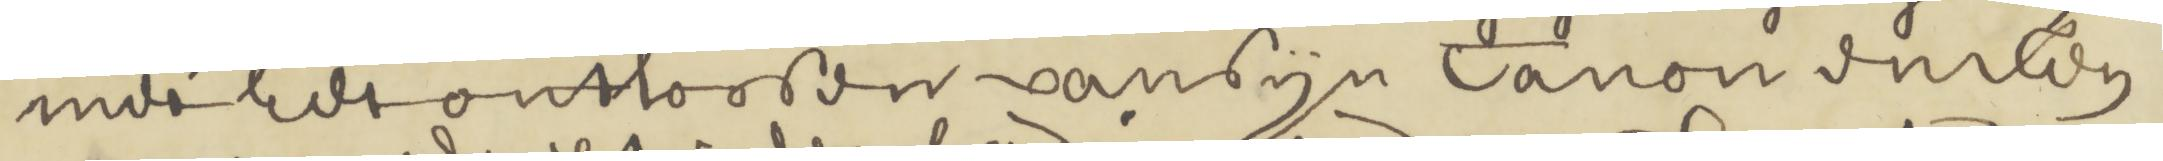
met het ontlossen van sijn canon en Een
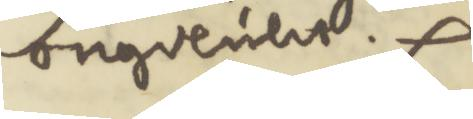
ongelijk.
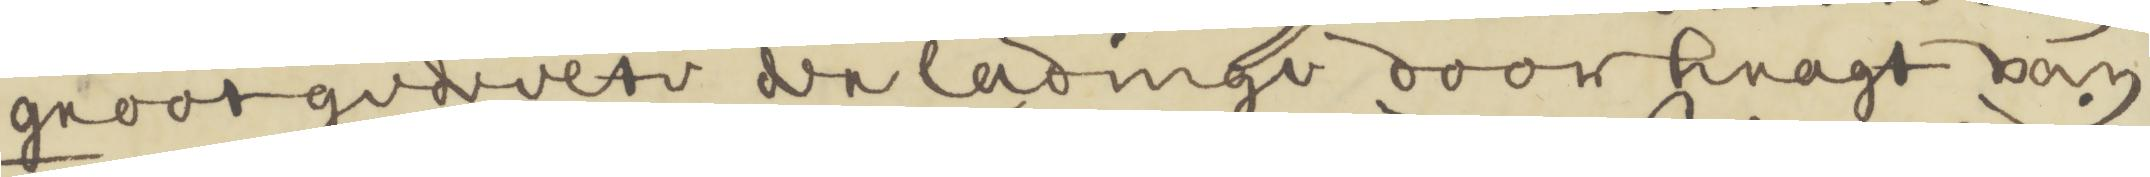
groot gedeelte der ladinge door kragt van
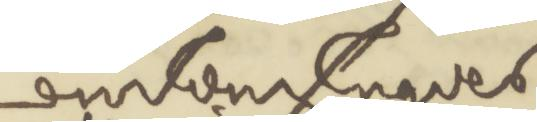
en Een Engels
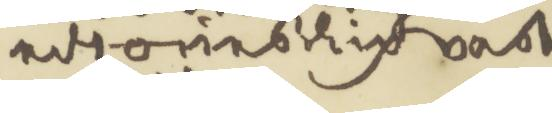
retourschip vast
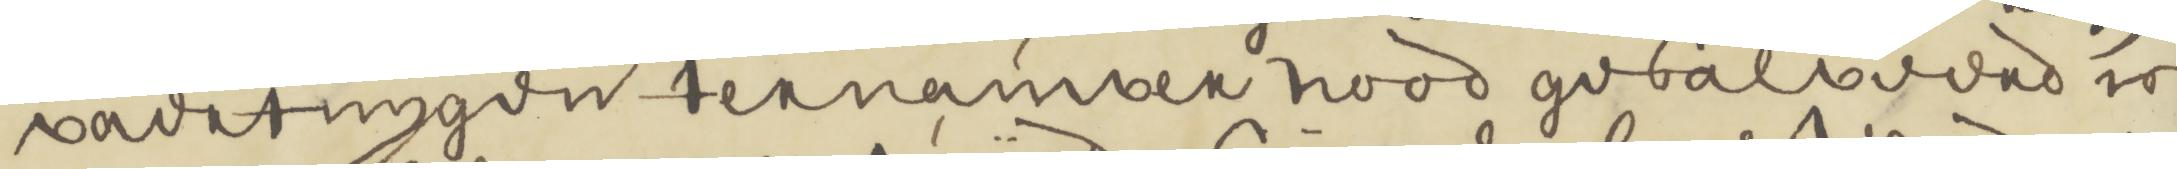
vaertuijgen ter nauwer nood gesalveerd is
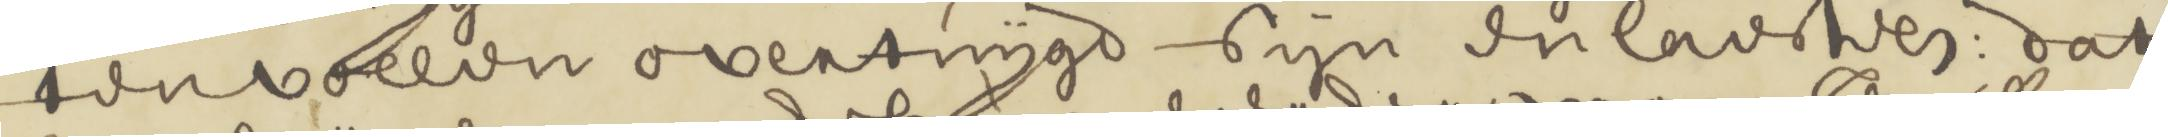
ten vollen overtuijgd sijn en laestelijk dat
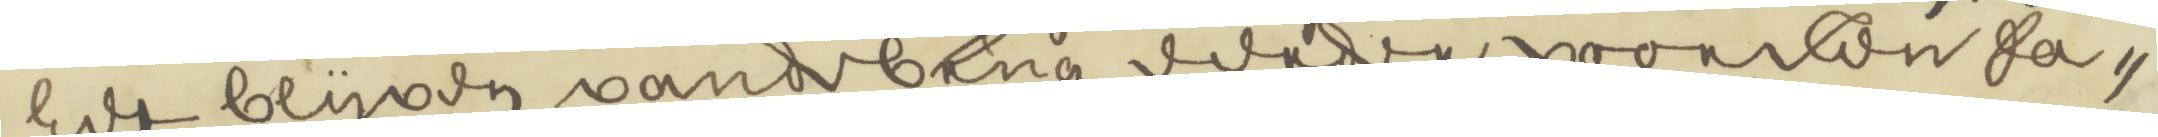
het blijven van de brug eerder voor Een fa„
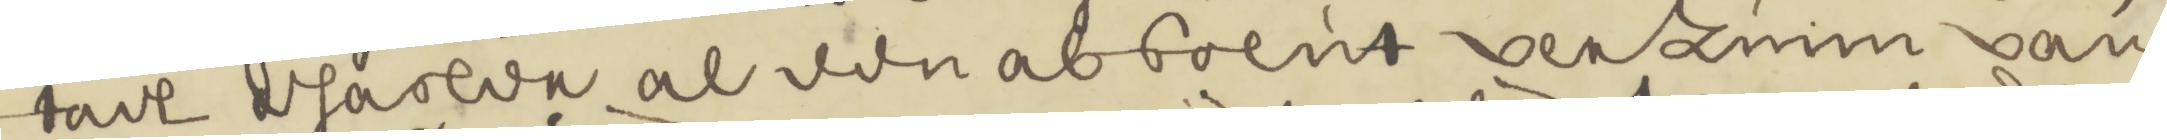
tael desaster al een absolut verzuim van
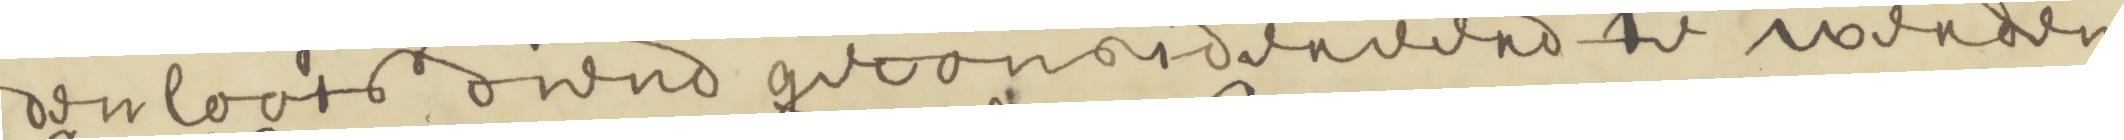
den loots diend geconsidereerd te werden
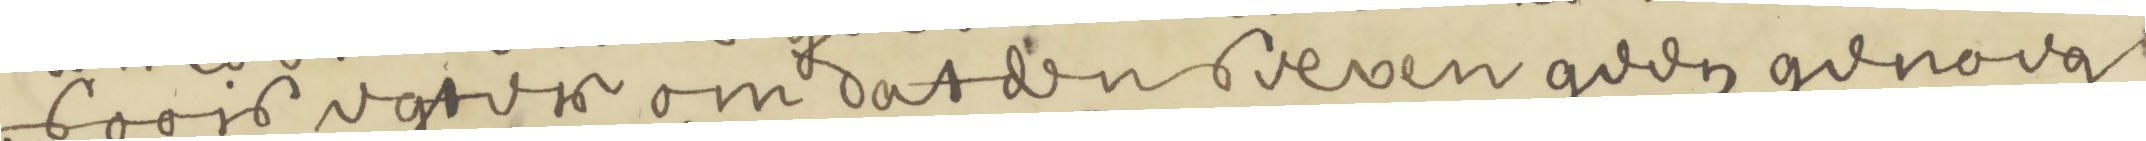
soo is egters om dat den selven geen genoeg
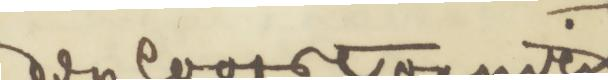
den loots cornelis
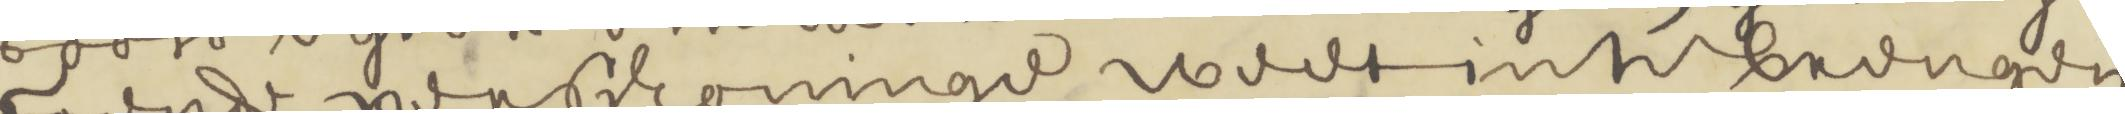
doende verschoninge weet in te brengen
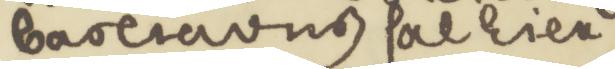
bastiaens sal hier
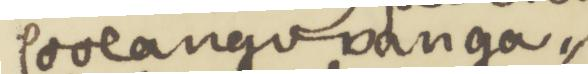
soolange van ge„
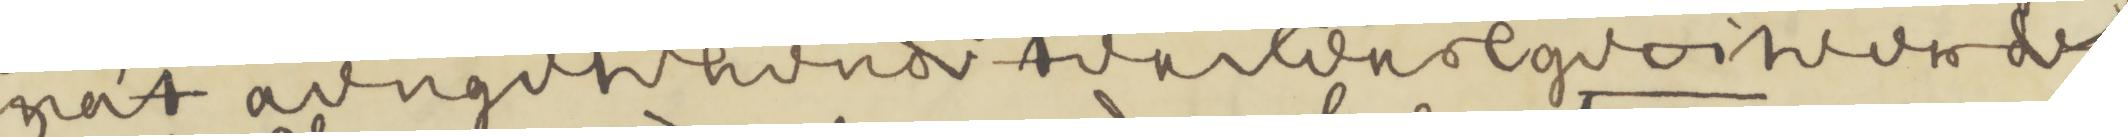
na't aengetekende ter Eerst geciteerde
